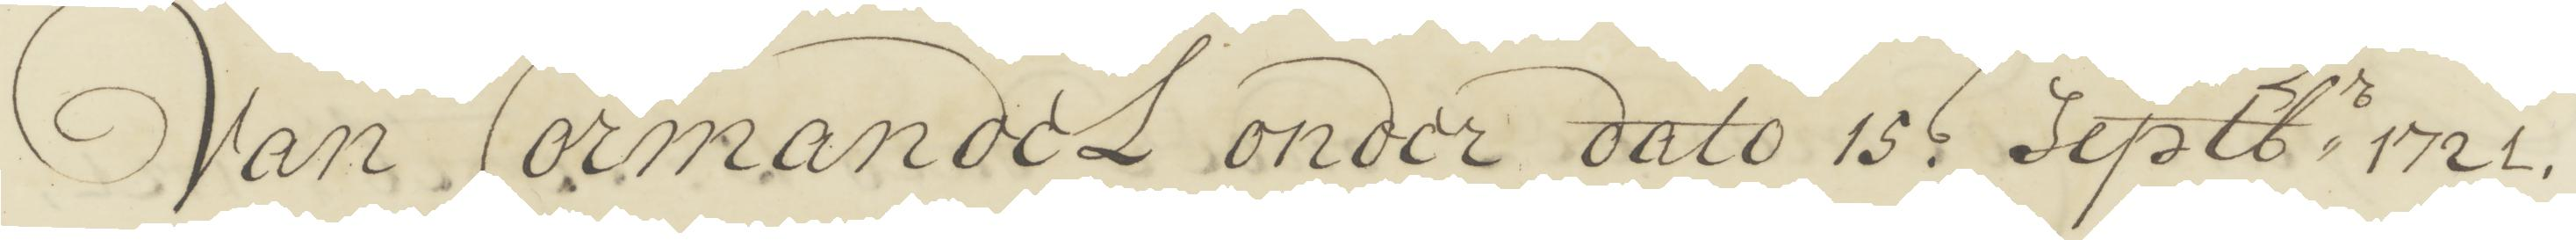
Van Cormandel onder dato 15:' Septb„r 1721.
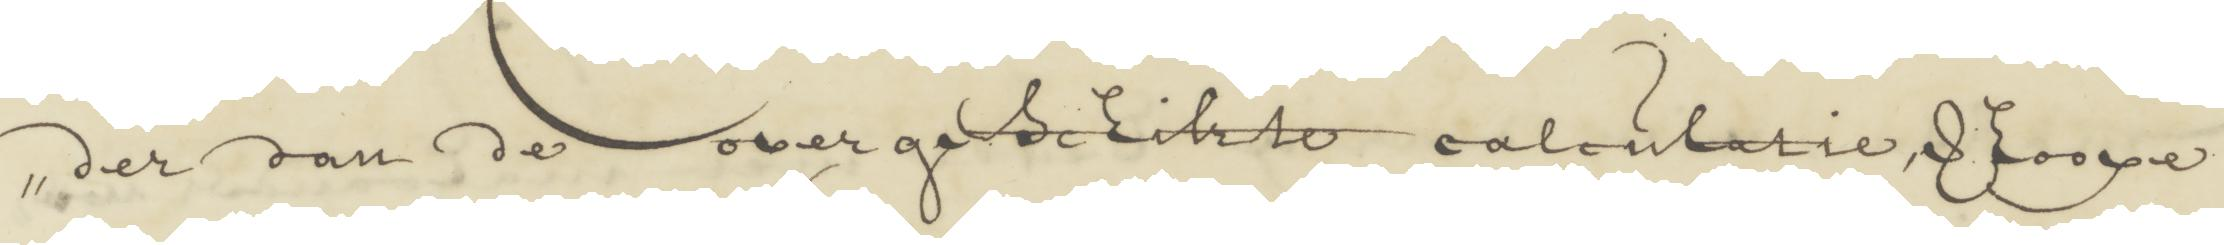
„der dan de overgeschikte calculatie, verhoope
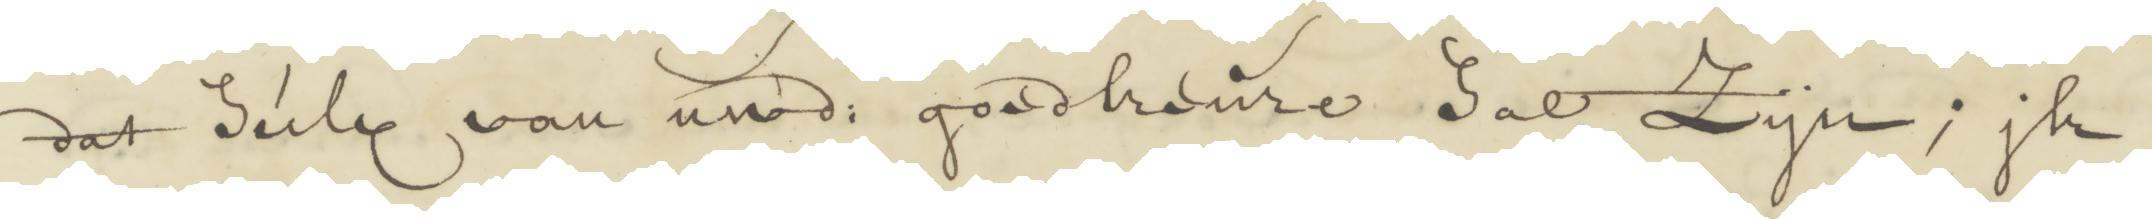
dat sulx van uwd: goedkeure sal zijn; jk
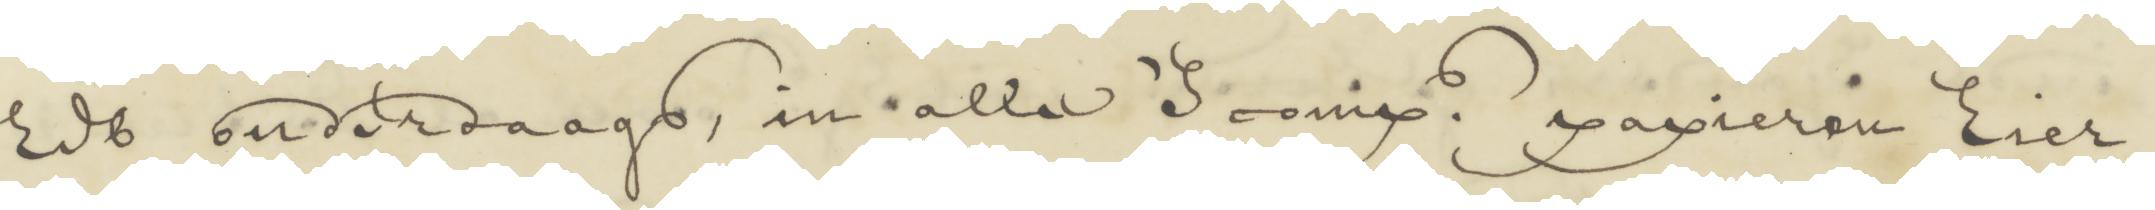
heb onderdaags, in alle ’s comp.s papieren hier
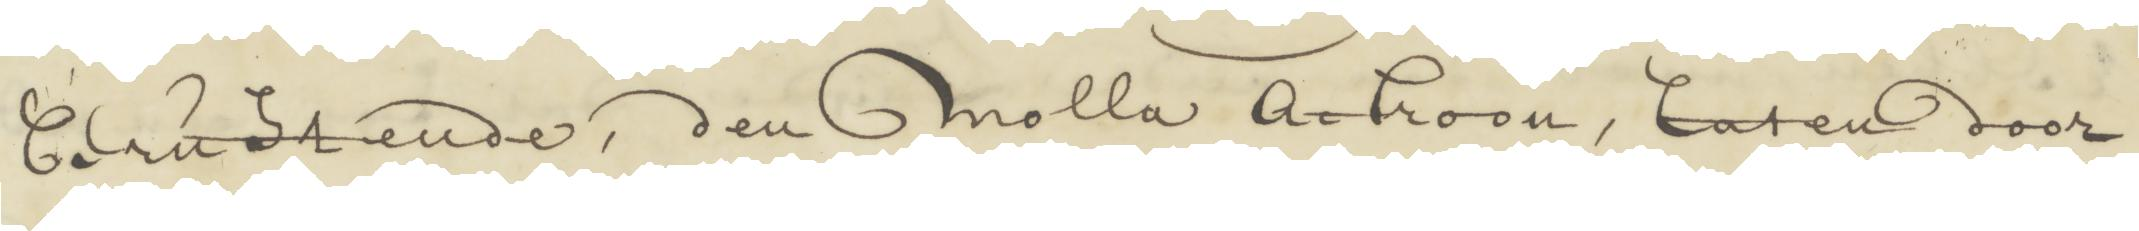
berustende, den Molla ackoon, laten door
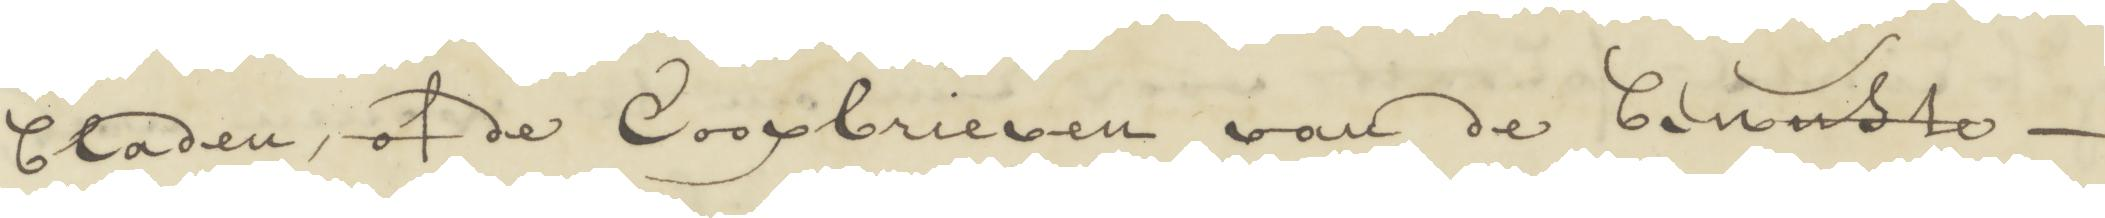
bladen, of de Coopbrieven van de bewuste —
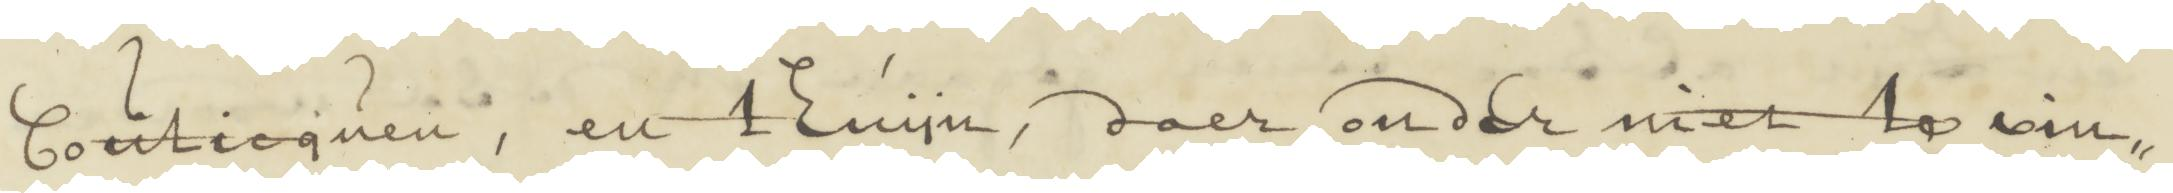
bouticquen, en thuijn, daer onder niet te vin„
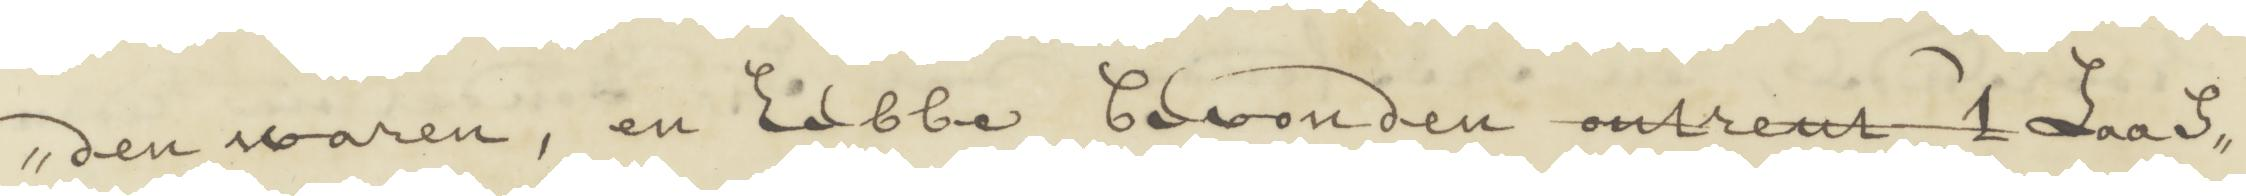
„den waren, en hebbe bevonden ontrent ’t Laas„
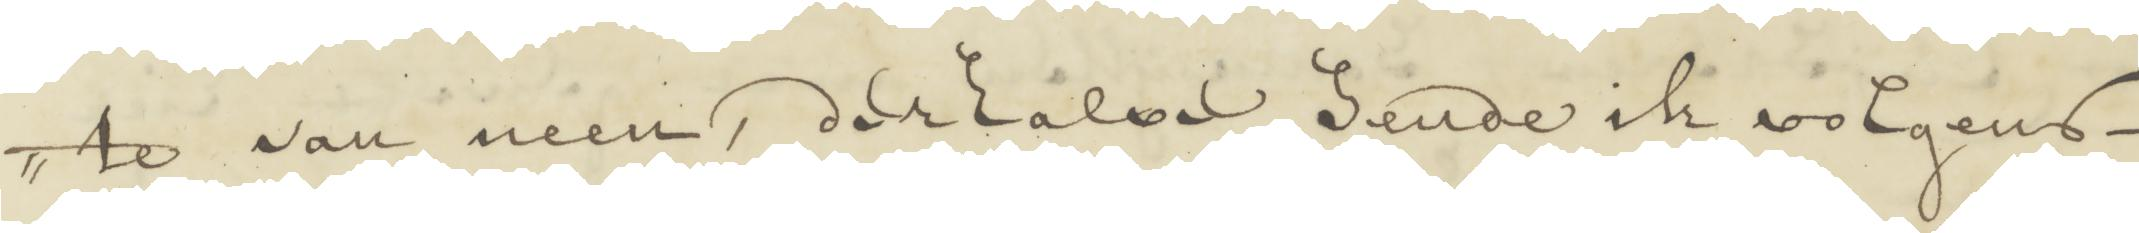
„te van neen, derhalve sende ik volgens —
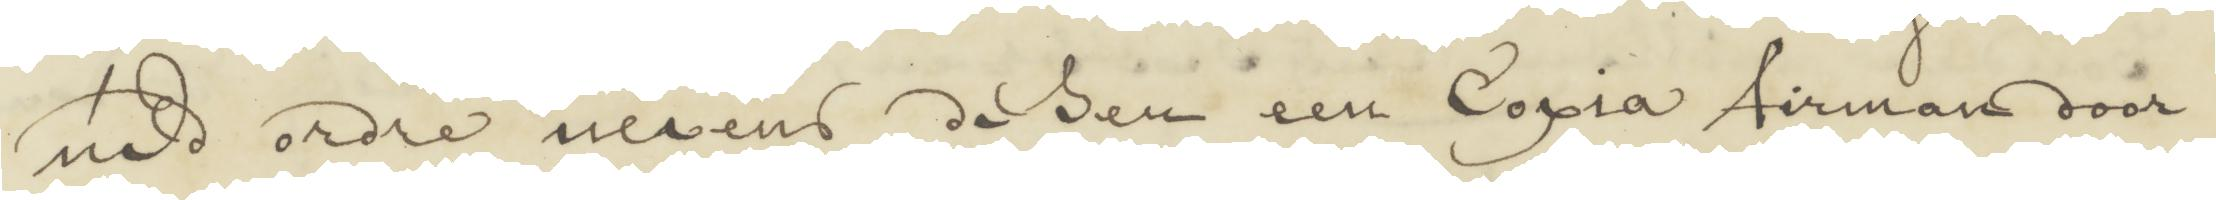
uEd ordre nevens desen een Copia firman door
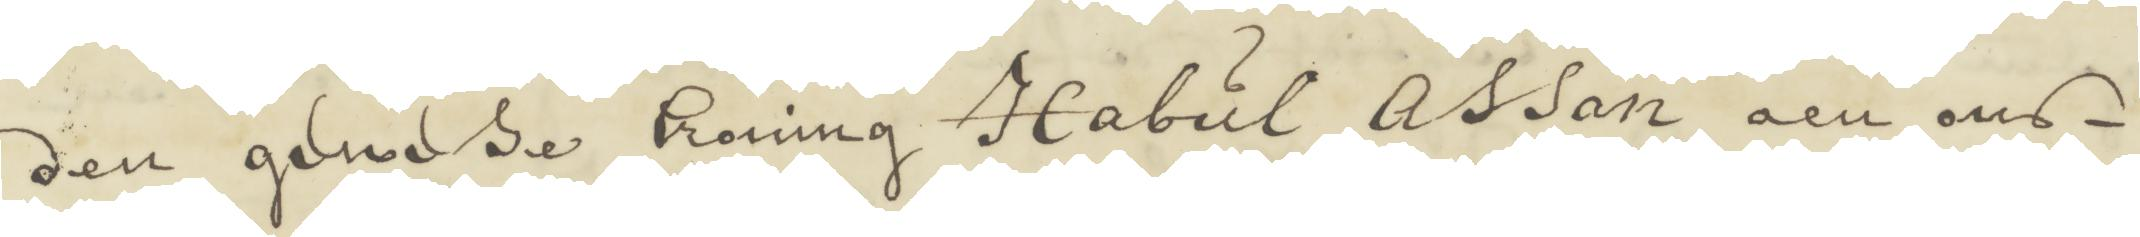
den gewese koning Habul Assan aen ons —
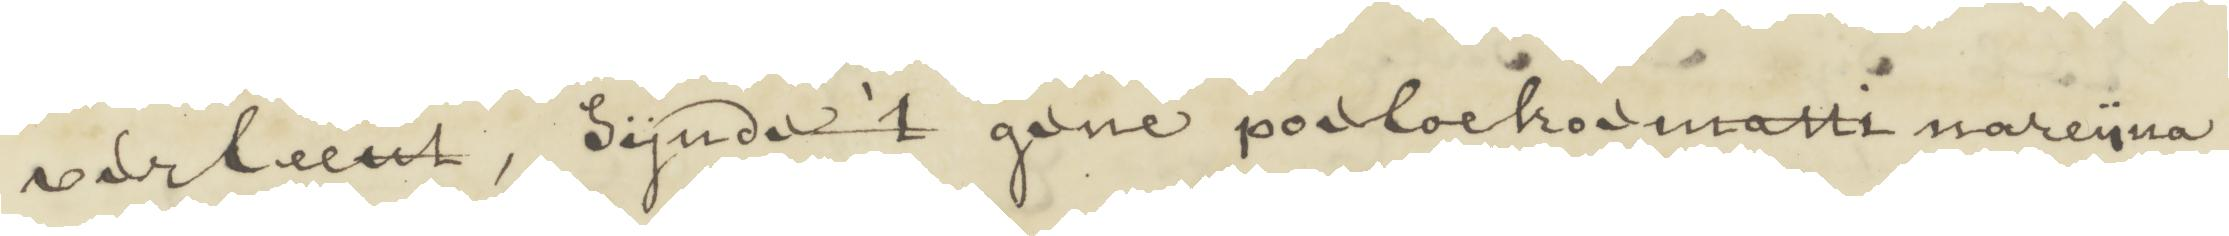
verleent, sijnde ’t gene poeloekoematti nareijna
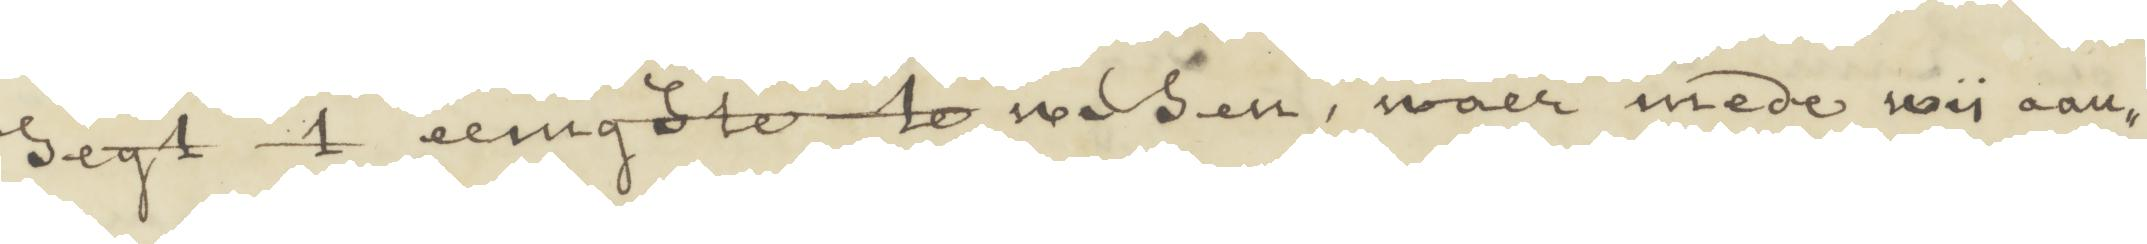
segt ’t eenigste te wesen, waer mede wij aan„
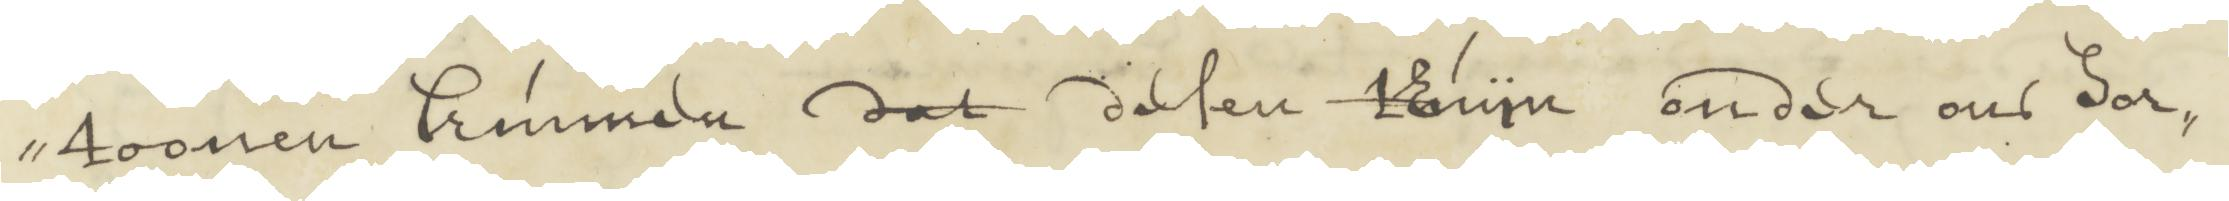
„toonen kunnen dat desen thuijn onder ons sor„
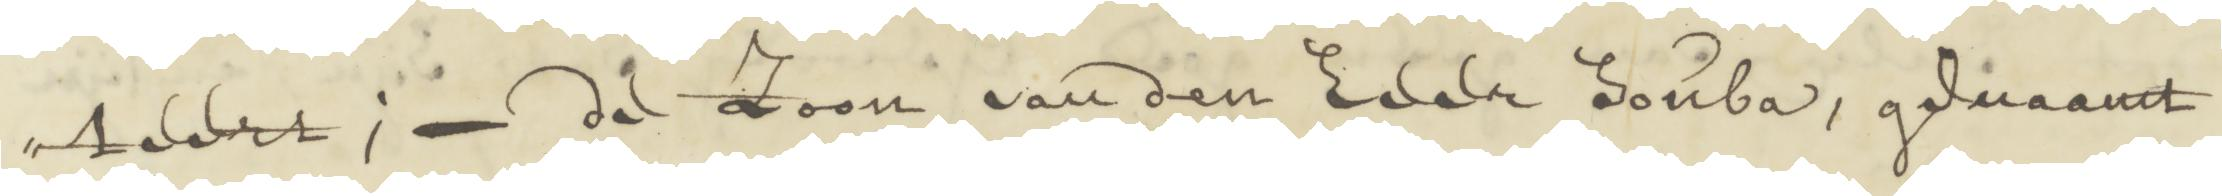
„teert; — de zoon van den heer souba, genaamt
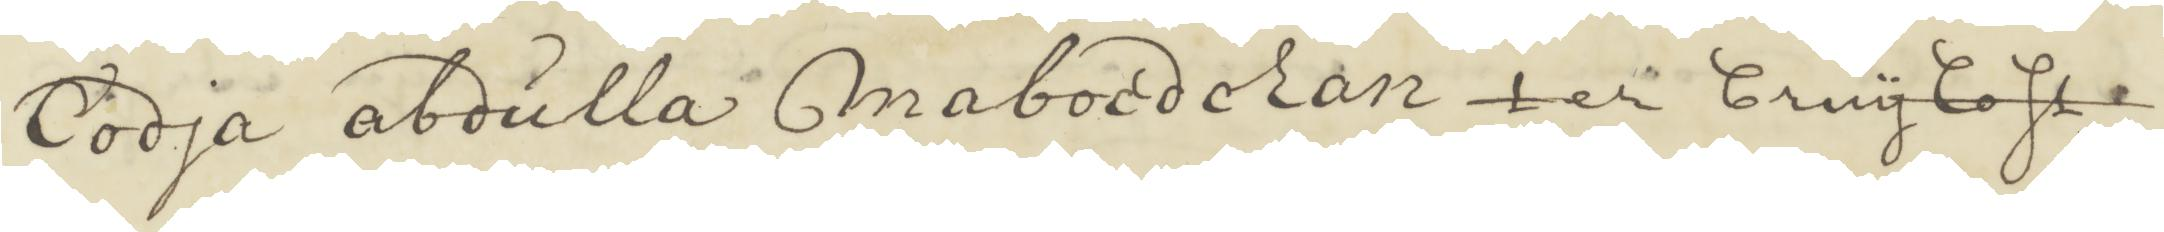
Codja abdulla Maboedchan ter bruijloft
